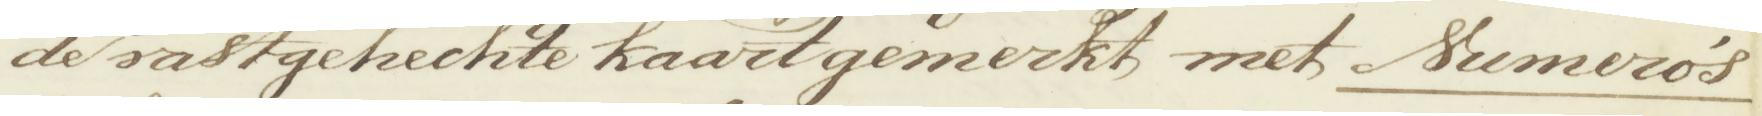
de vastgehechte kaart gemerkt met Numero's
